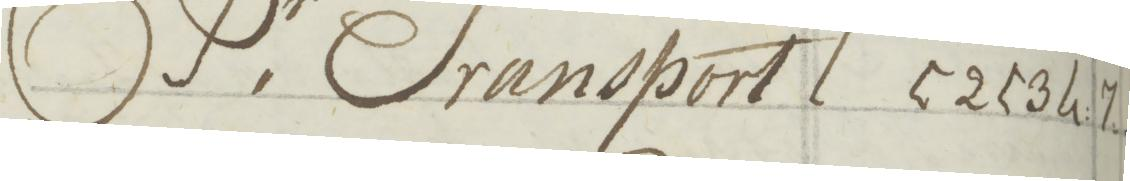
P„r Transport ƒ 52534:7:
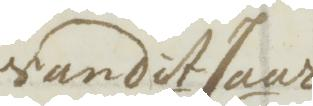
van dit Jaar
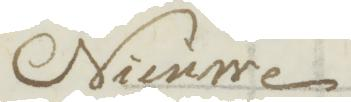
Nieuwe
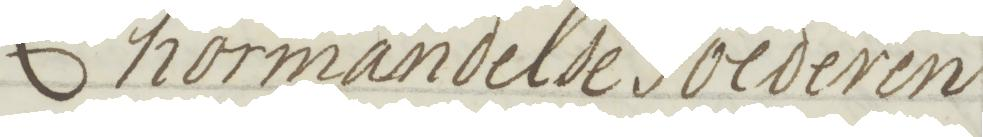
Chormandelse Goederen
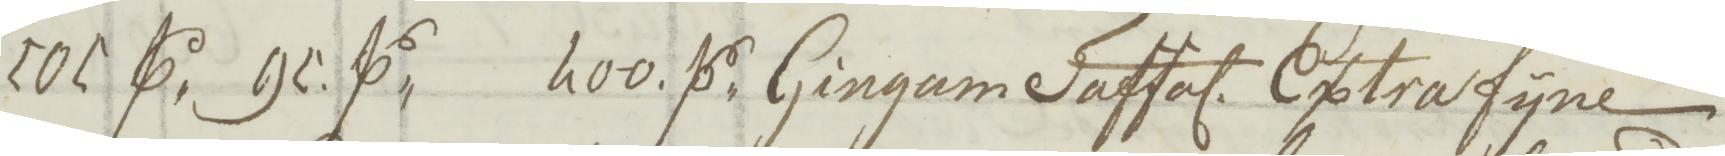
505 p„s 95.p„s 400.p„s Gingam Iaffas. Extra fijne
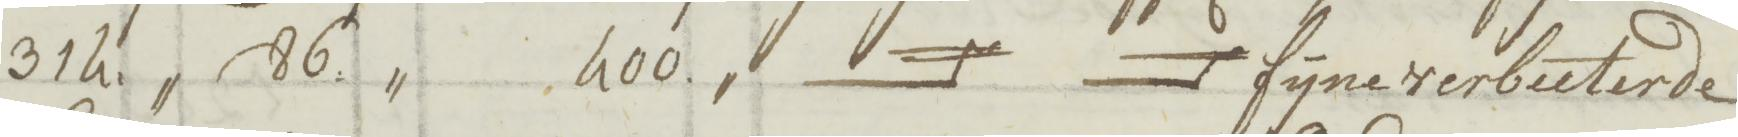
314 „ 86: „ 400.„ _o _o fijne verbeeterde
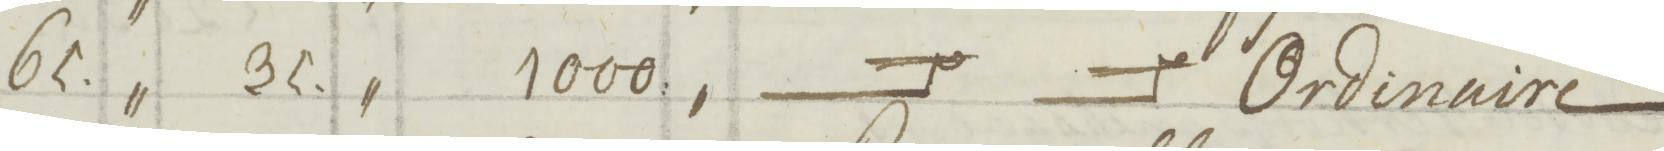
65 „ 35. „ 1000: „ _o _o Ordinaire
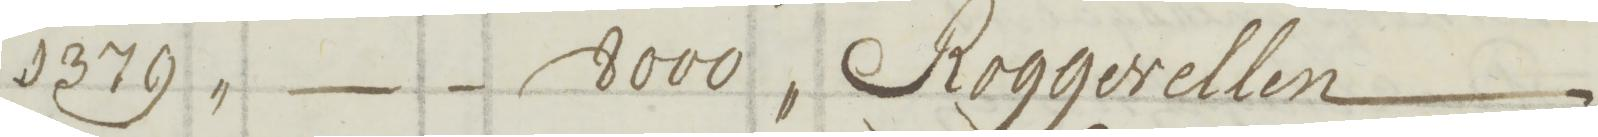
1379 — - „ 8000 „ Roggevellen
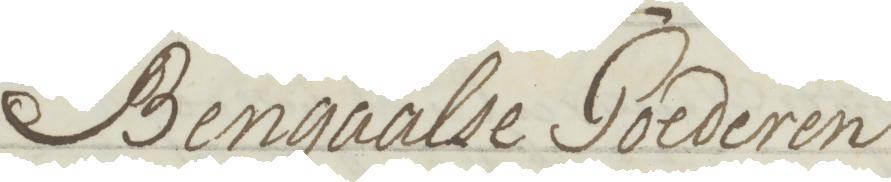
Bengaalse Goederen
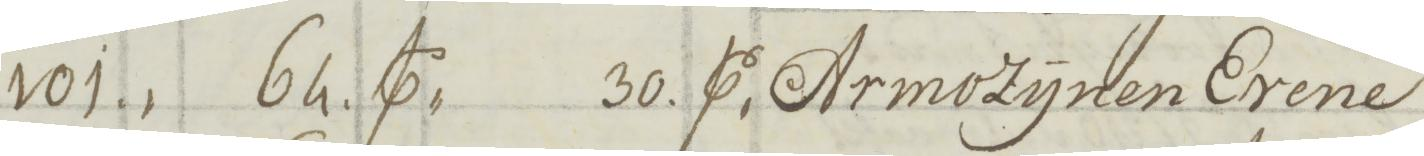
101.„ 64. p„s 30. p„s Armozijnen Evene
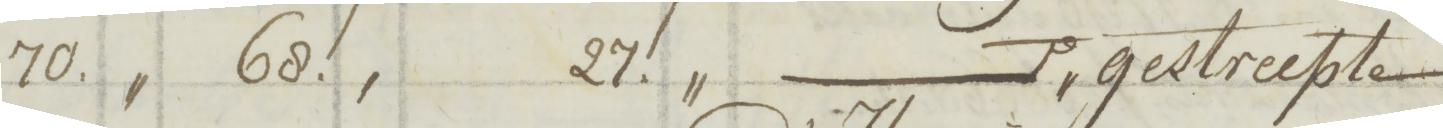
70. „ 68.„ 27.„ _„o gestreepte
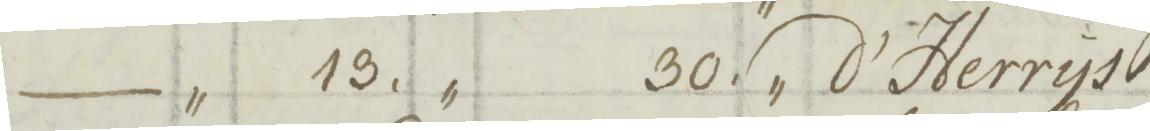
— „ 13. „ 30. „ d’ Herrijs
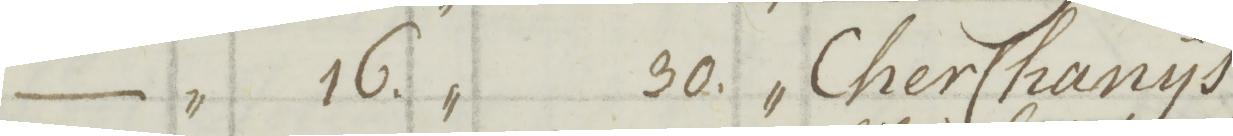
— „ 16. „ 30. „ Cherchanijs
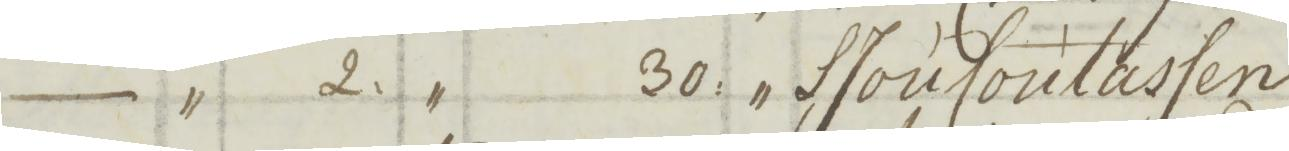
— „ 2: „ 30:„ Sjoucouttassen
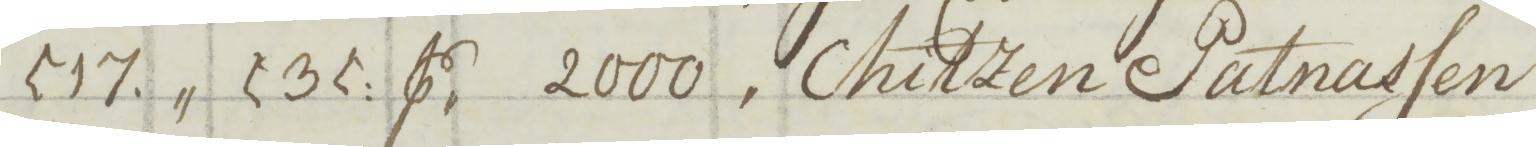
517 „ 535: p„s 2000 „ Chitzen Patnassen
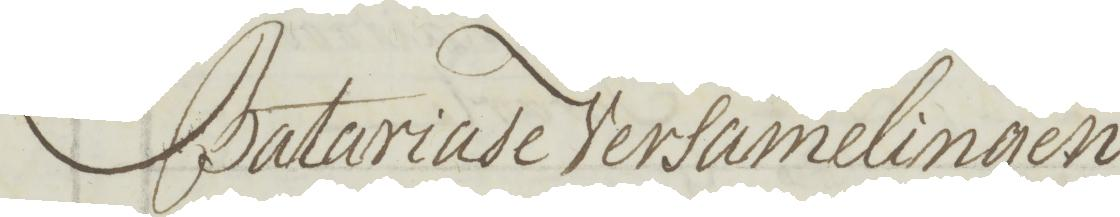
Bataviase Versamelingen
